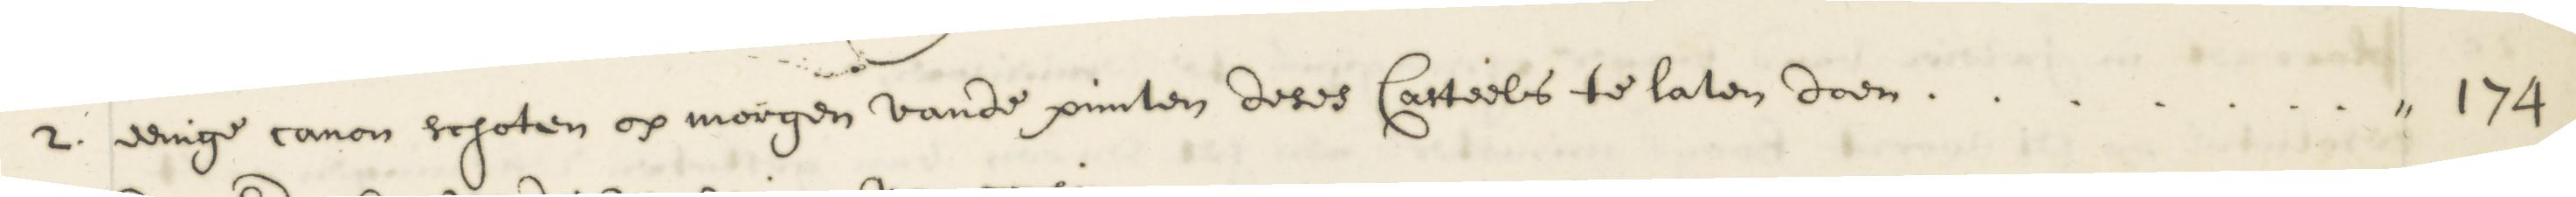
2. eenige canon schoten op morgen vande punten deses Casteels te laten doen - - - - - - - „ 174
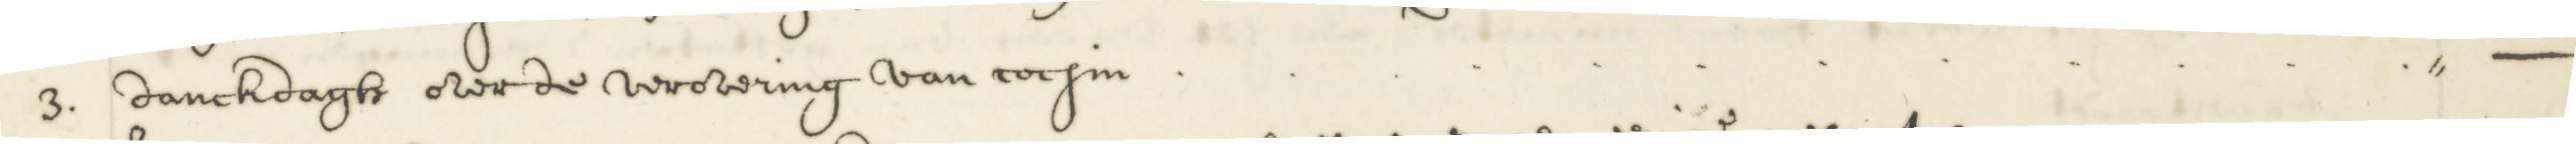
3. danckdagh over de verovering van cochin - - - - - - - - - - - -„ —
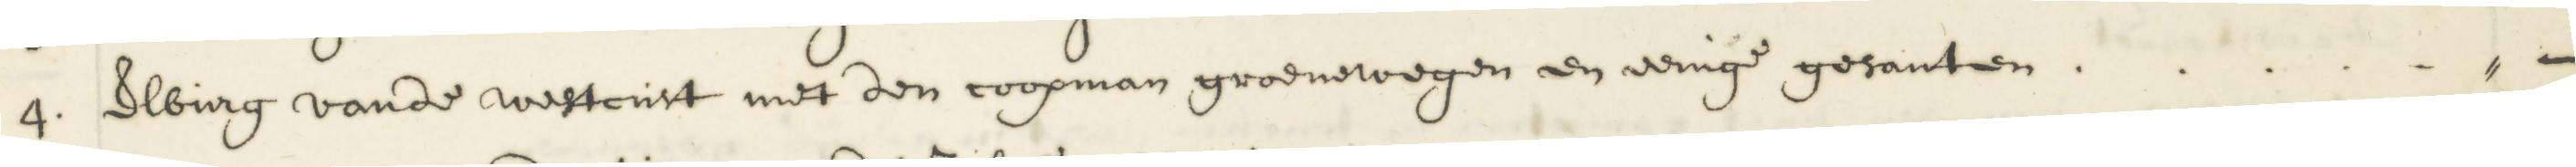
4. Elburg vande westcust met den coopman groenewegen en eenige gesanten - - - - - „
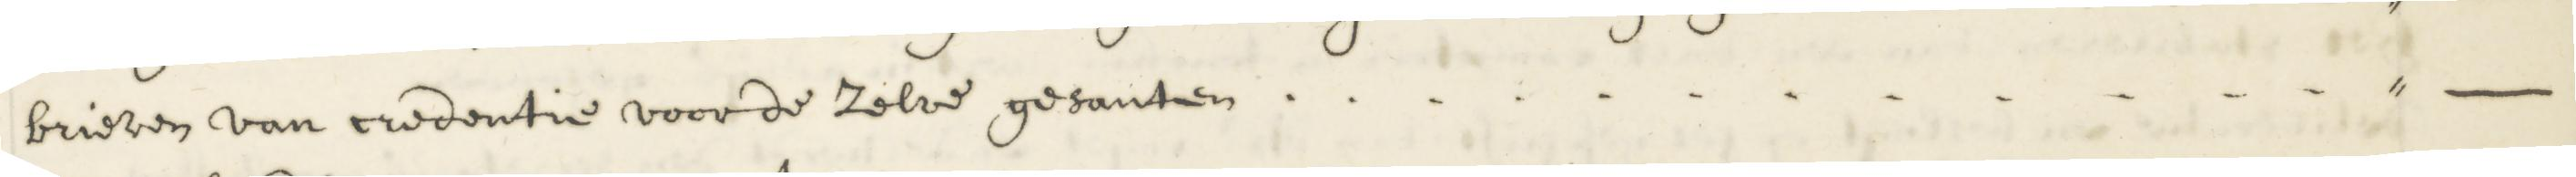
brieven van credentie voor de zelve gesanten - - - - - - - - - - - - „ —
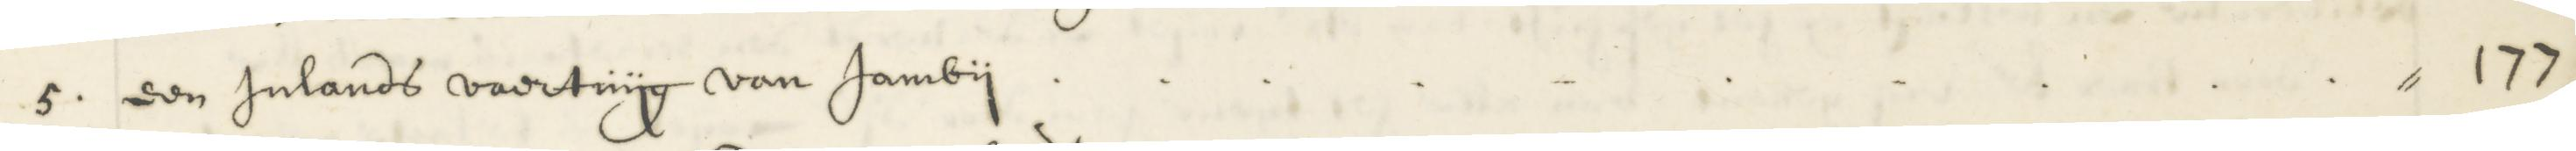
5. een Jnlands vaertuijg van Jambij - - - - - - - - - - „ 177
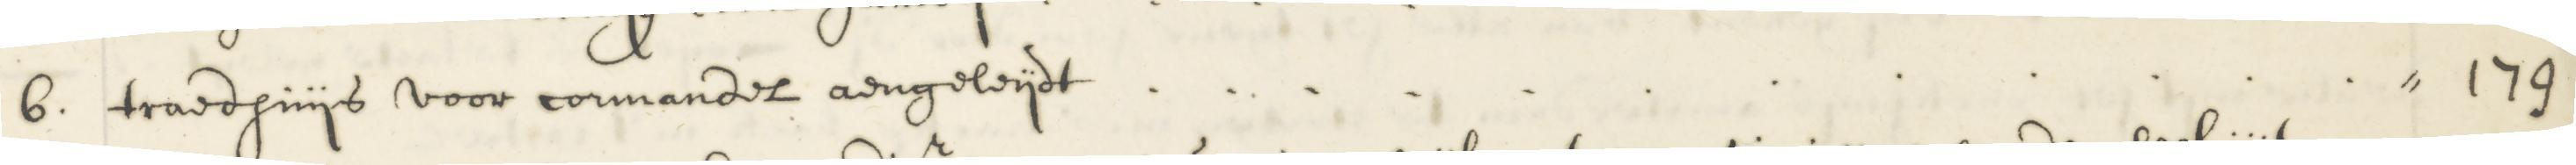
6. t raedhuijs voor cormandel aengeleijdt - - - - - - - - - - - - „ 179
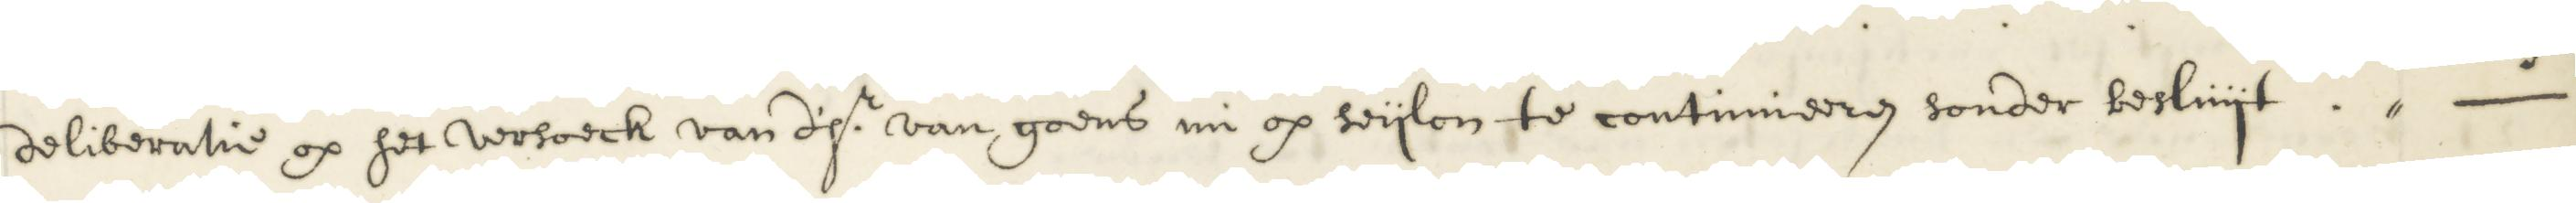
deliberatie op het versoeck van d'h.r van goens nu op seijlon te continueeren sonder besluijt - „ —
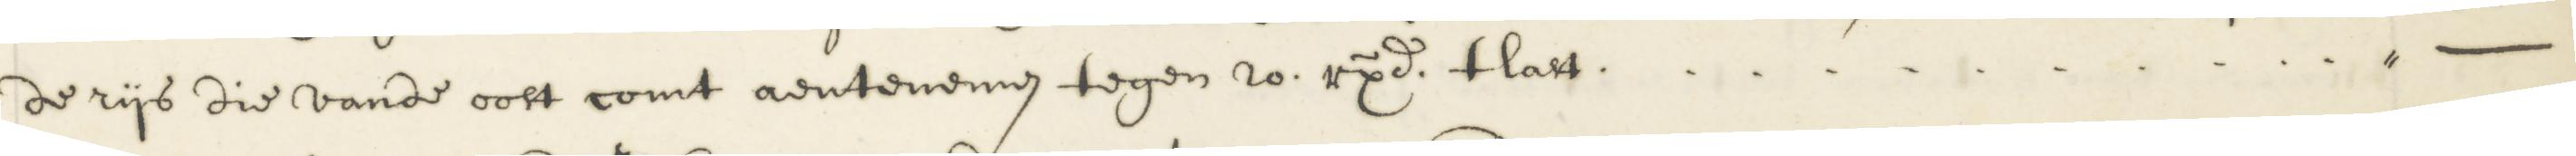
de rijs die vande oost comt aentenemen tegen 20. rxd. t last - - - - - - - - - - -„ —
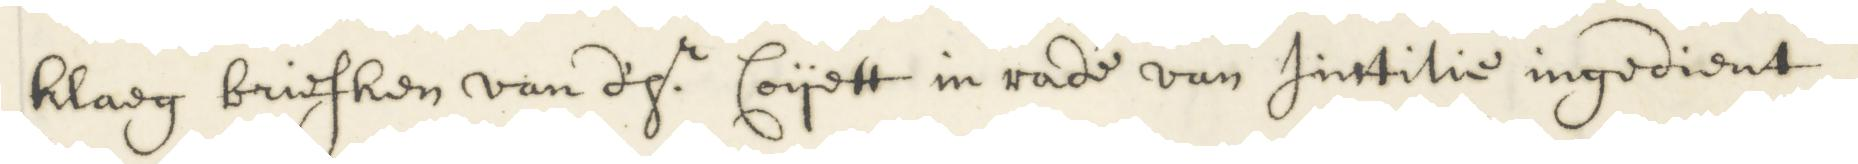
klaeg briefken van d'hr. Coijett in rade van Justitie ingedient
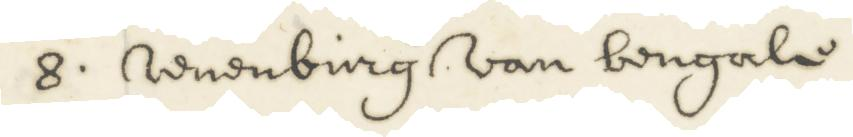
8. venenburg van bengale
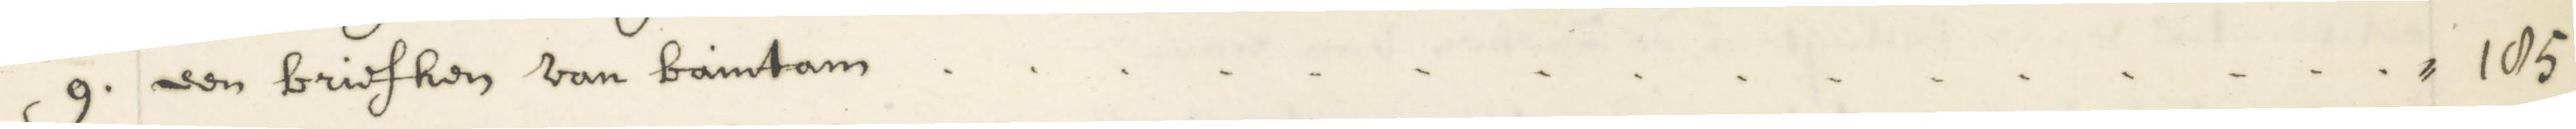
9. een briefken van bamtam - - - - - - - - - - - - - - - - „ 185
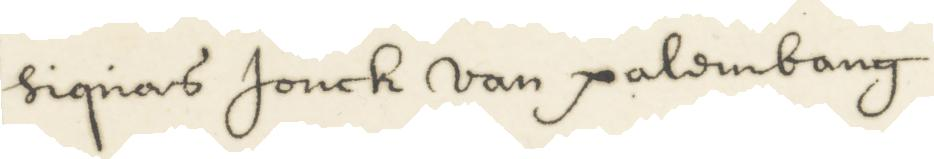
siquas Jonck van palembang
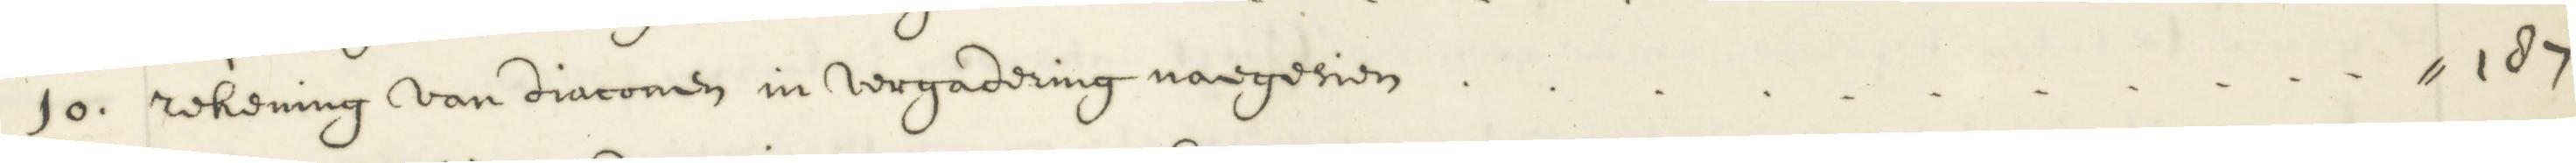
10. rekening van diaconen in vergadering naegesien - - - - - - - - - - - „ 187
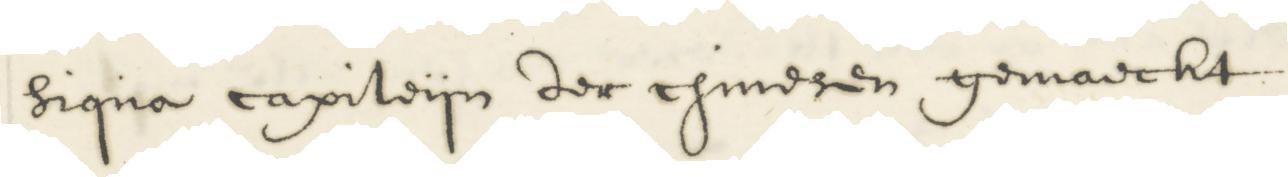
siqua capiteijn der chinesen gemaeckt
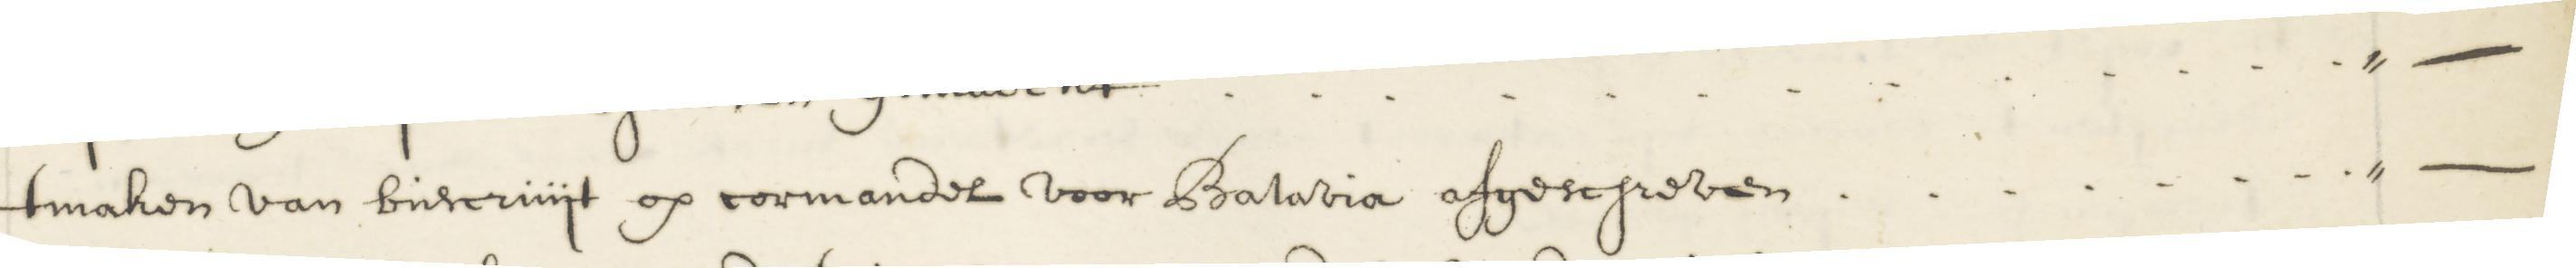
t maken van buscruijt op cormandel voor Batavia afgeschreven - - - - - - - - „ —
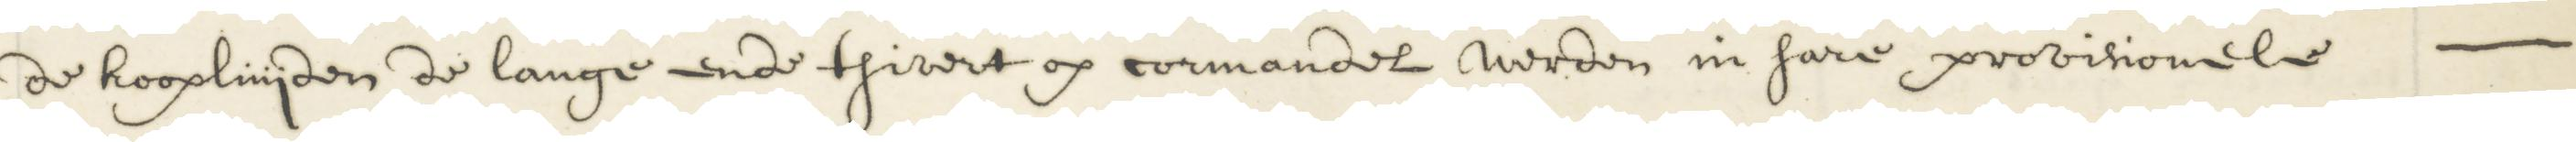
de koopluijden de lange ende thivert op cormandel werden in hare provisionele —
